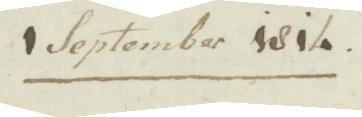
1 September 1814.
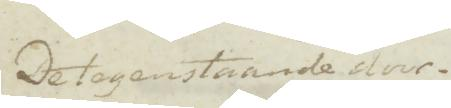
De tegenstaande door-
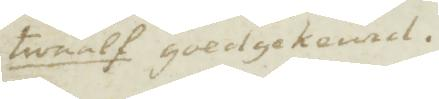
twaalf goedgekeurd.
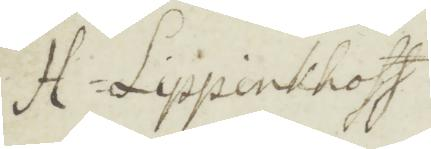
H=Lippinkhoff
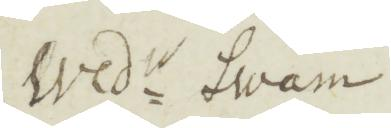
Wed=w Swam
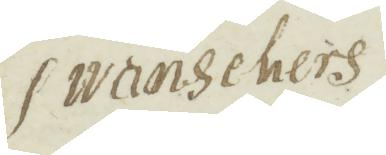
S wanschers
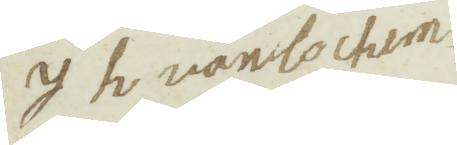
J h van lochem
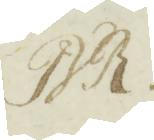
JVR
